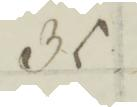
35:
